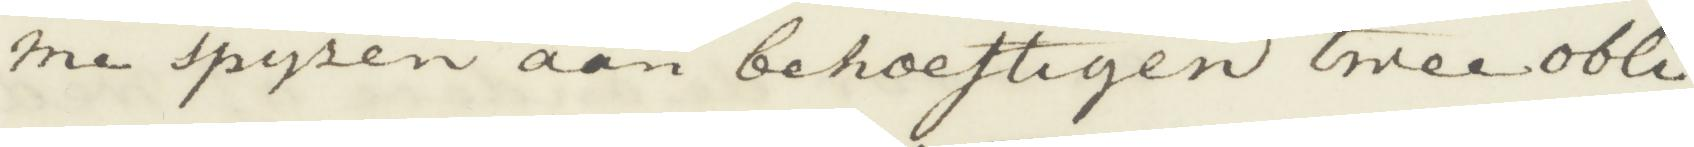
me spyzen aan behoeftigen twee obli
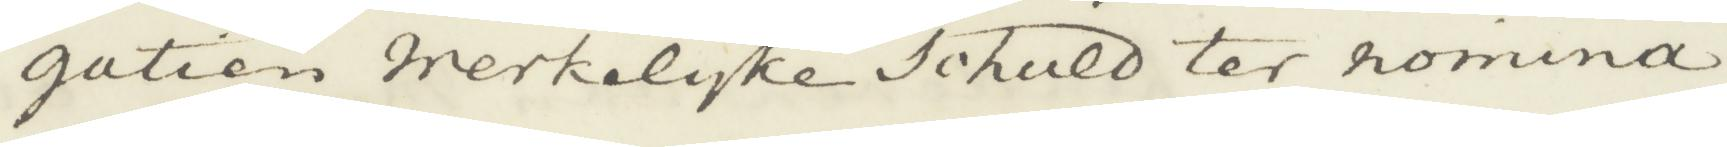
gatien werkelyke schuld ter nomina
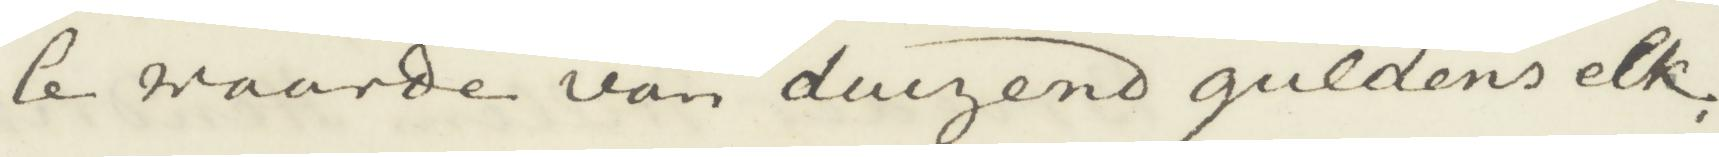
le waarde van duizend guldens elk,
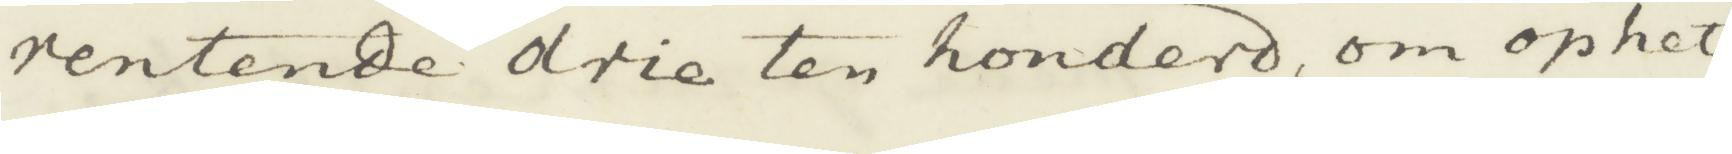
rentende drie ten honderd, om op het
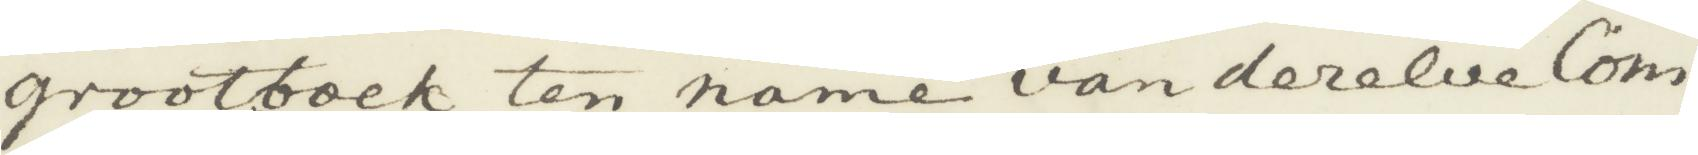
grootboek ten name van dezelve Com
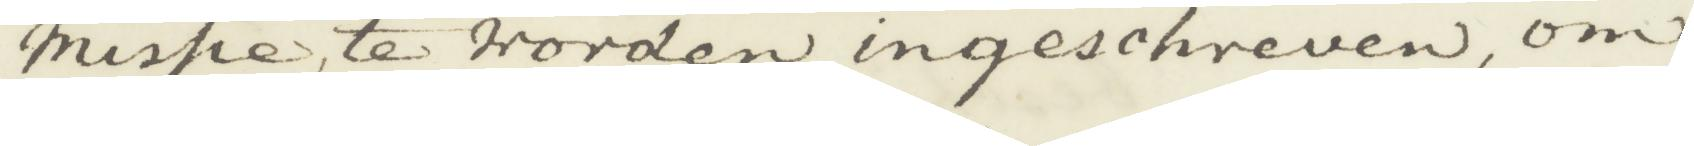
missie te worden ingeschreven, om
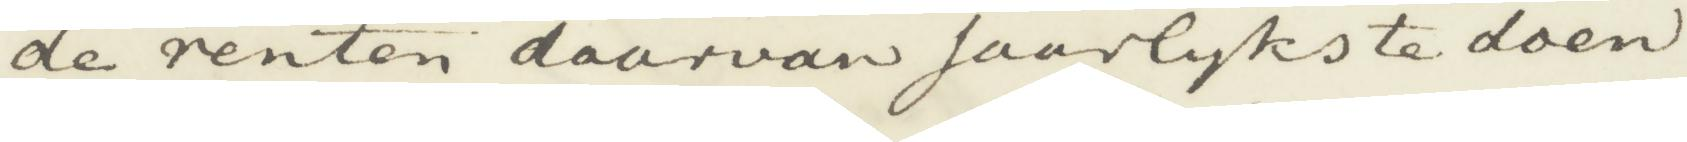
de renten daarvan Jaarlyks te doen
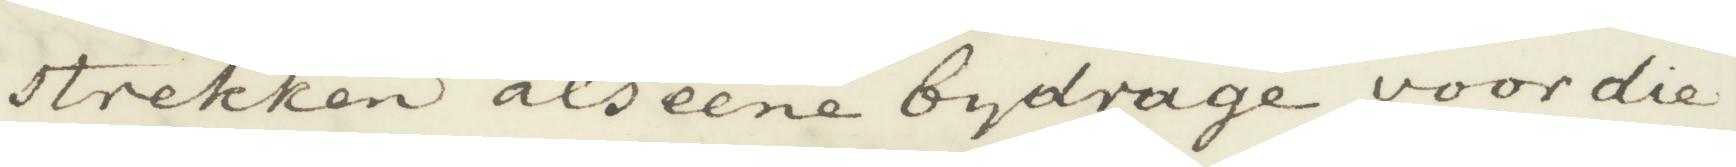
strekken als eene bydrage voor die
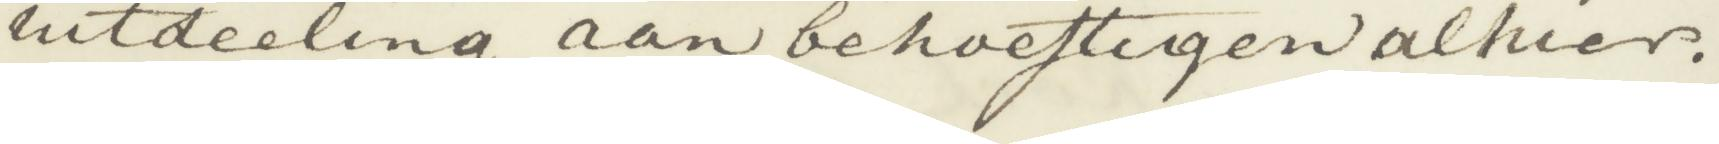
uitdeeling aan behoeftigen alhier.
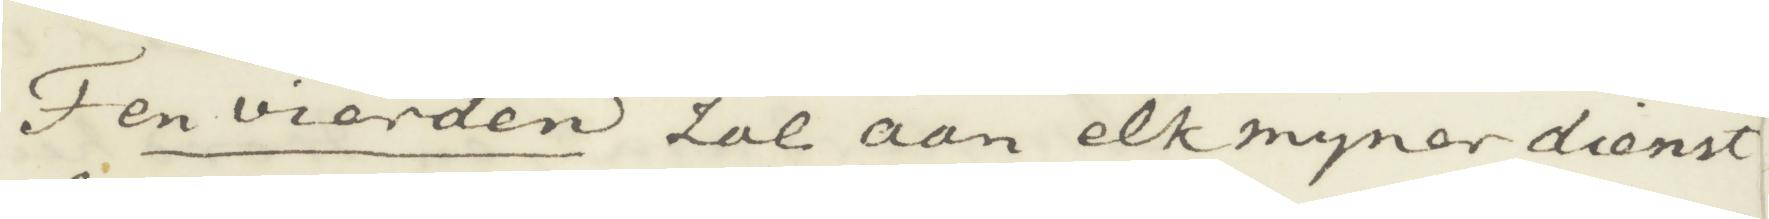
Ten vierden zal aan elk myner dienst
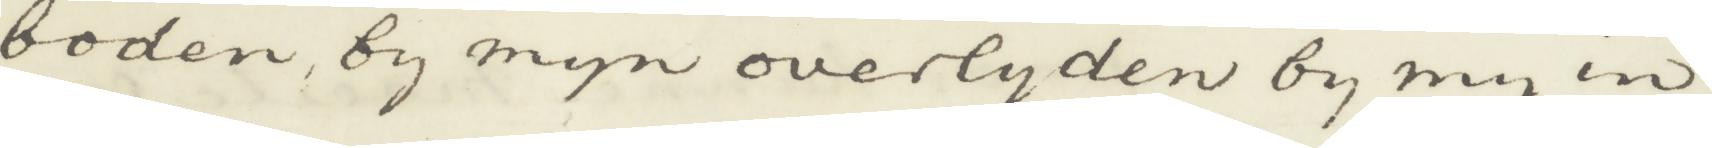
boden, by myn overlyden by my in
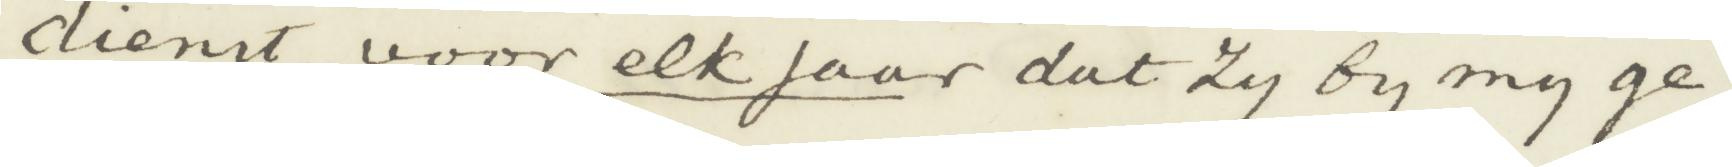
dienst, voor elk jaar dat zy by my ge
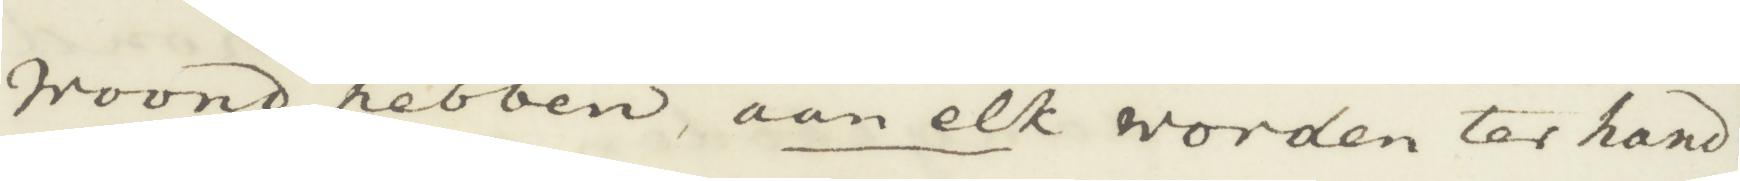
woond hebben, aan elk worden ter hand
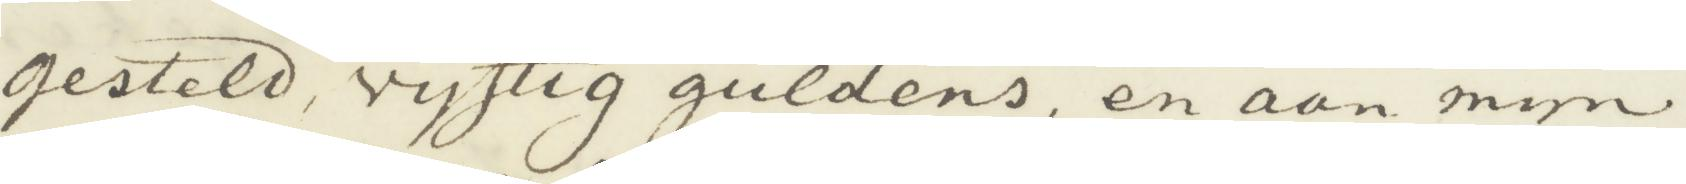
gesteld, vyftig guldens, en aan myn
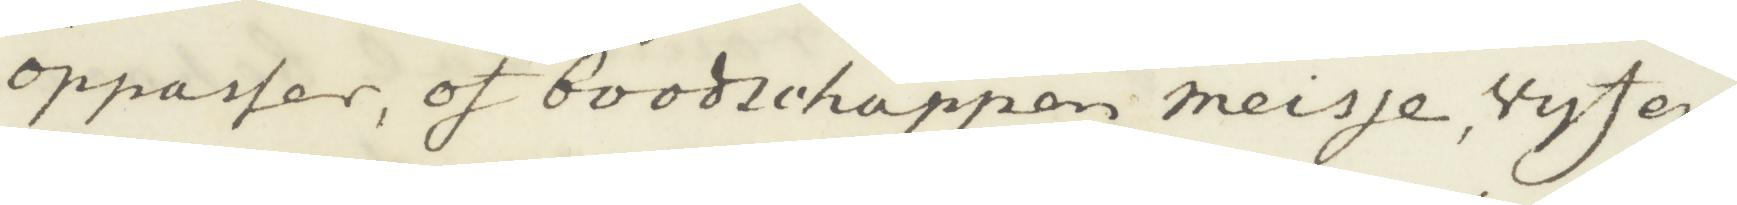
oppasser, of boodschappen meisje, vyf en
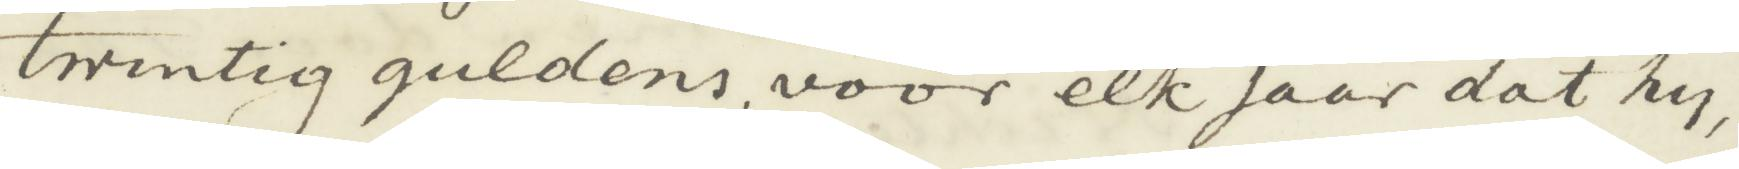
twintig guldens, voor elk jaar dat hy,
